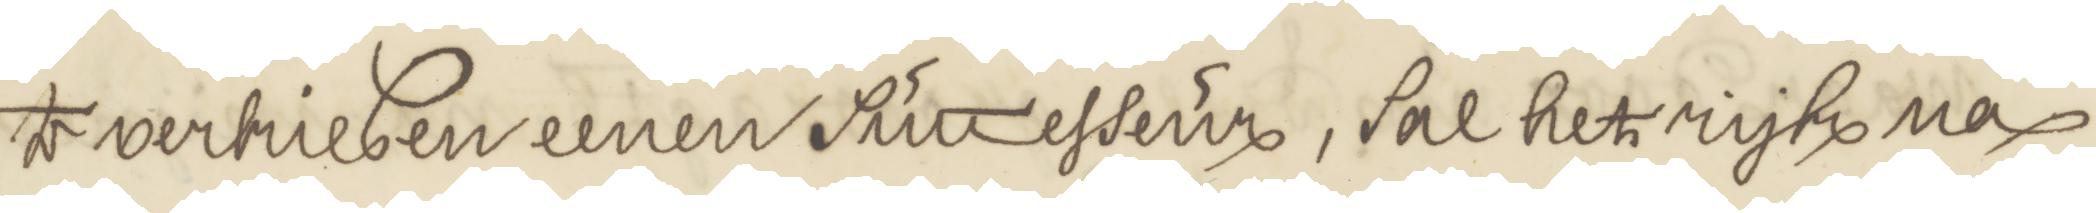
te verkiesen eenen successeur, sal het rijk na
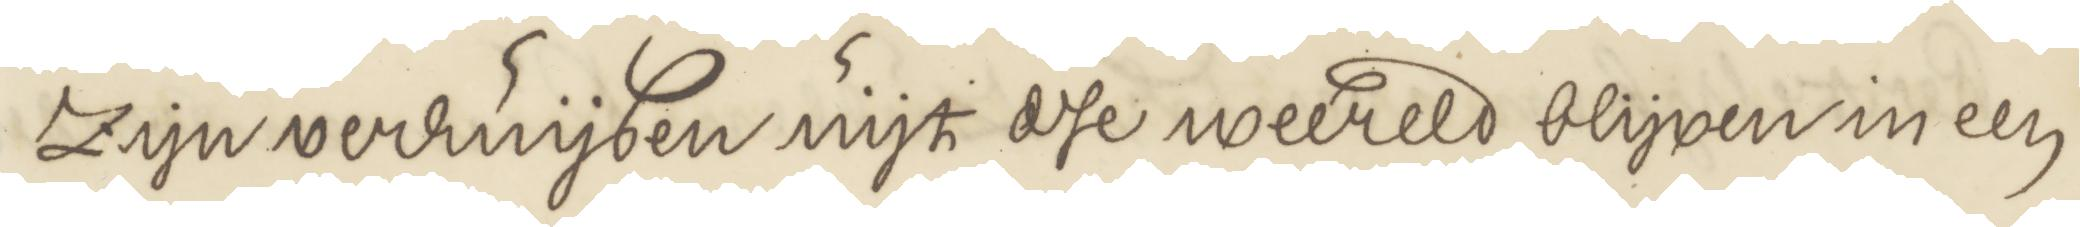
zijn verhuijsen uijt dese weereld blijven in een
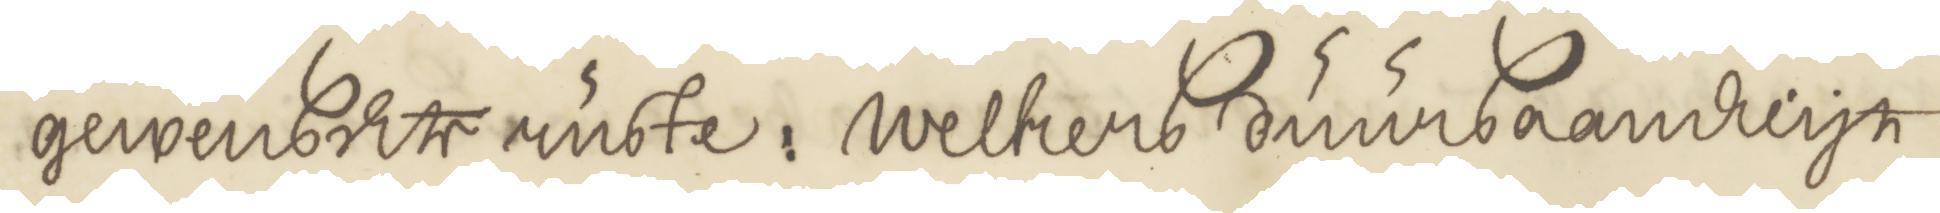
gewenschte ruste, welkers duursaamheijt
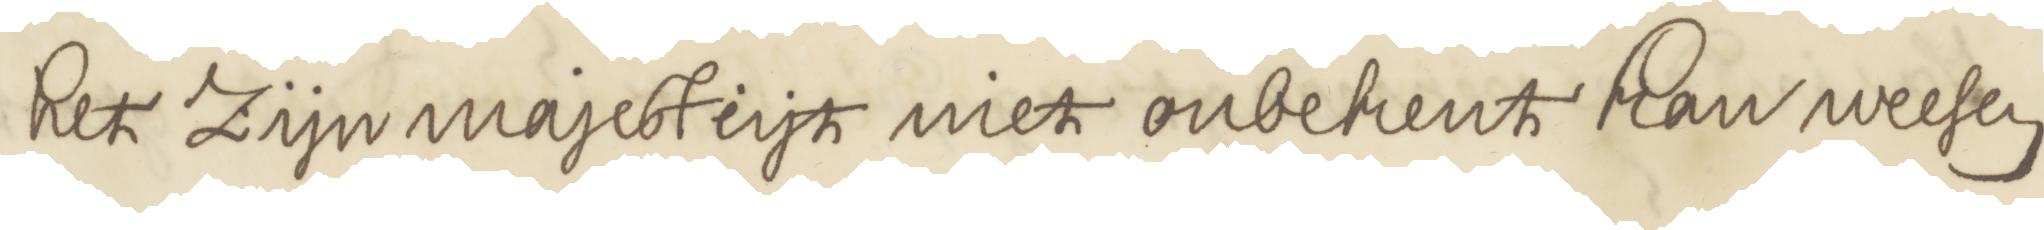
het zijn majesteijt niet onbekent kan weesen
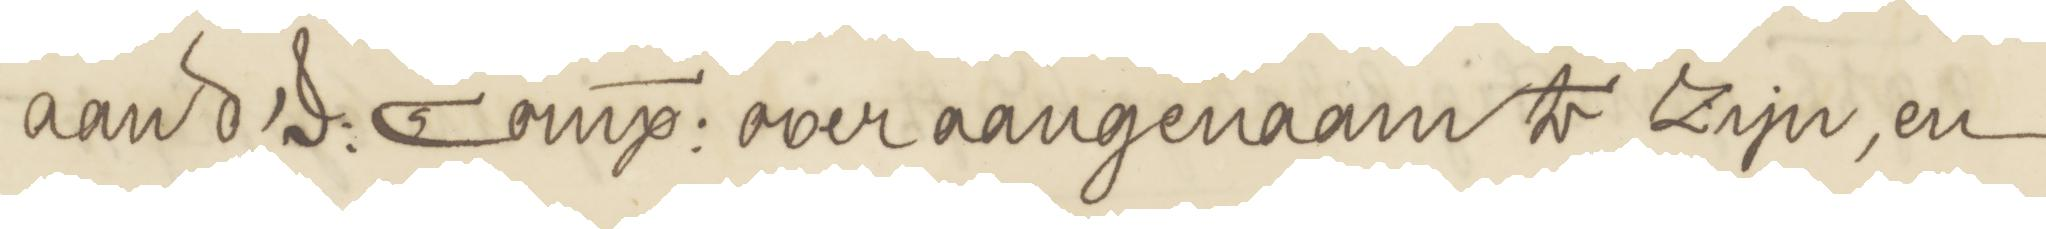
aan d’ E: comp: over aangenaam te zijn, en
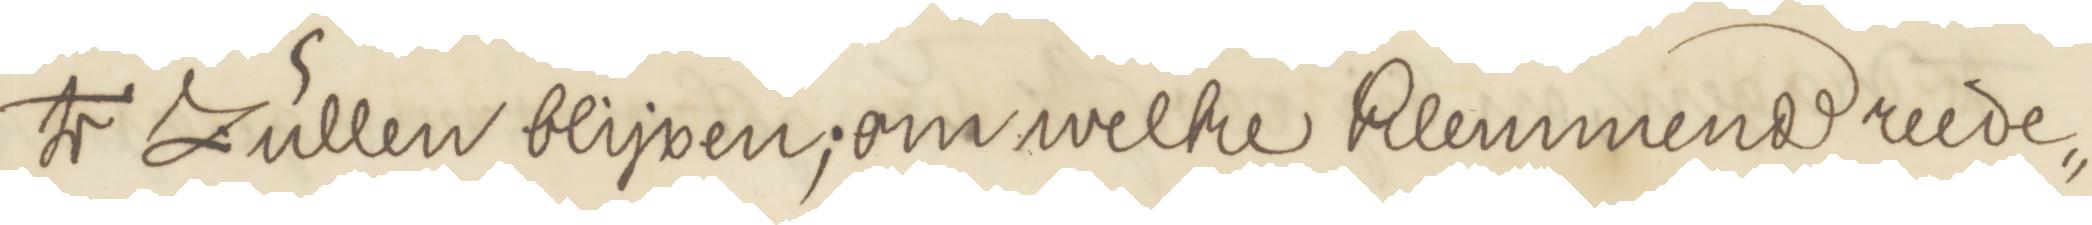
te zullen blijven; om welke klemmende reede„
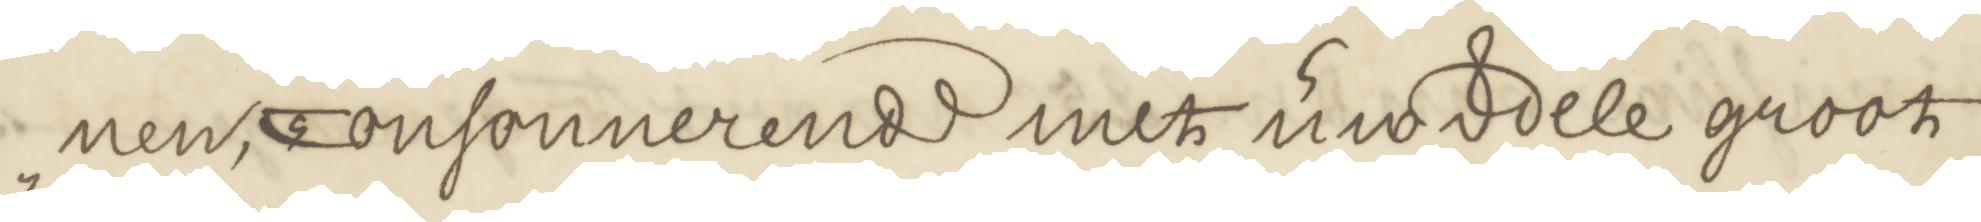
„nen, confonnerende met uw Edele groot
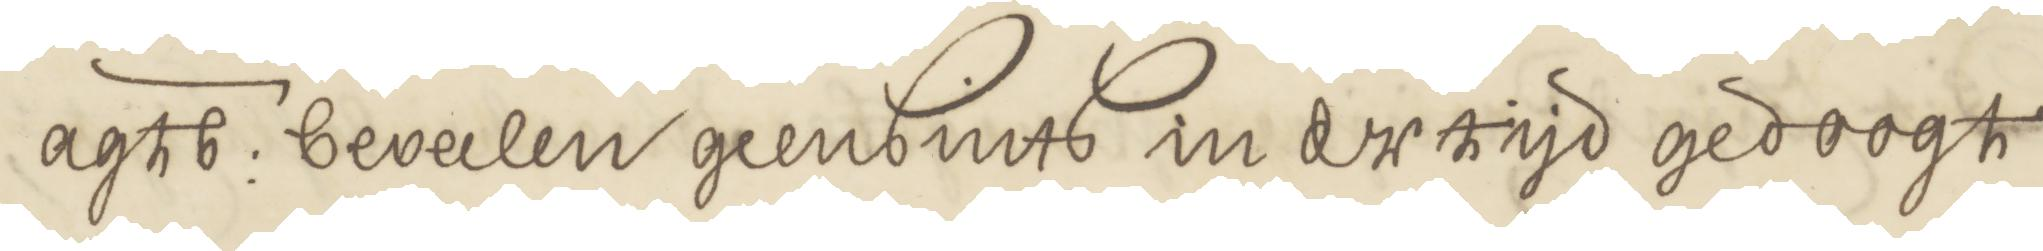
agtb: beveelen geensints in der tijd gedoogt
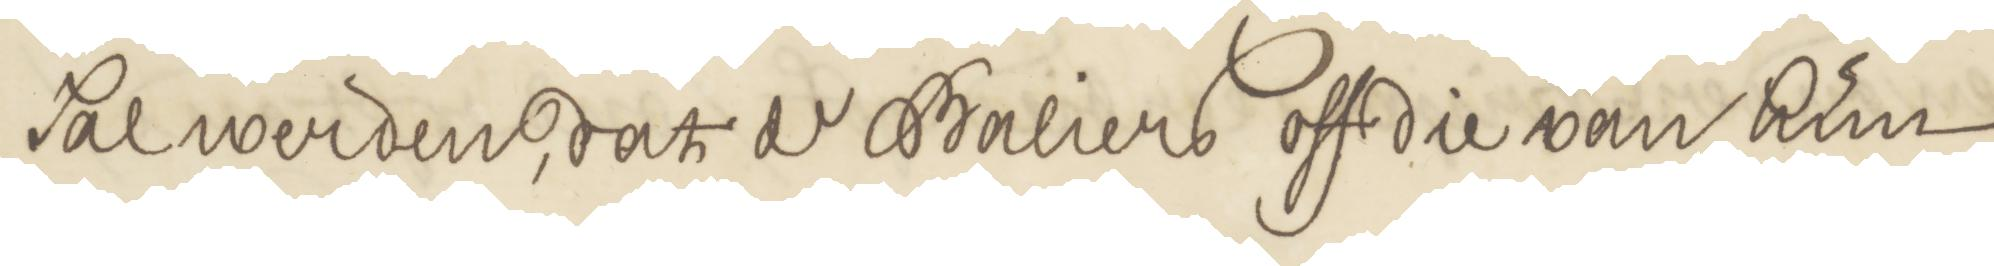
sal werden, dat de Baliers off die van hun
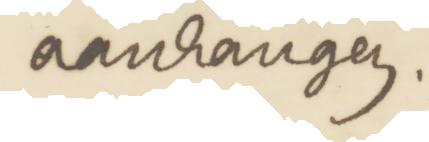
aanhangen
